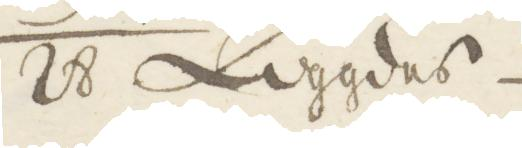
28 Leggers
